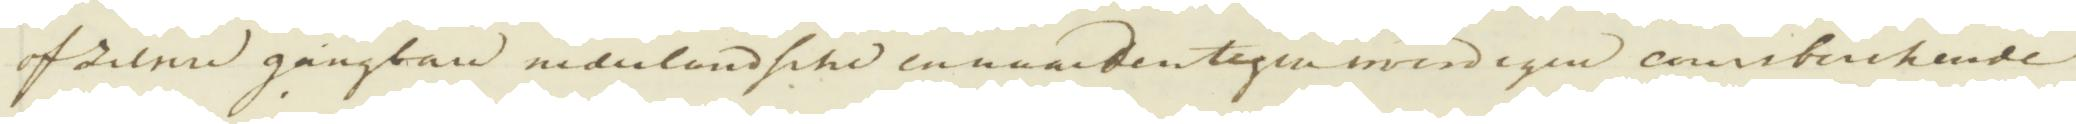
of zilvere gangbare nederlandsche en naar den tegenwoordigen cours berekende
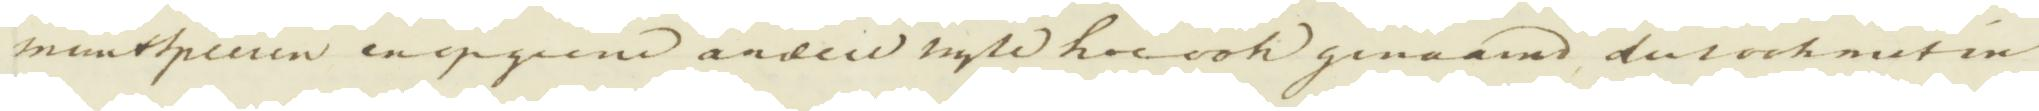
muntspecien en op geene andere wyse hoe ook genaamd, die ook niet in
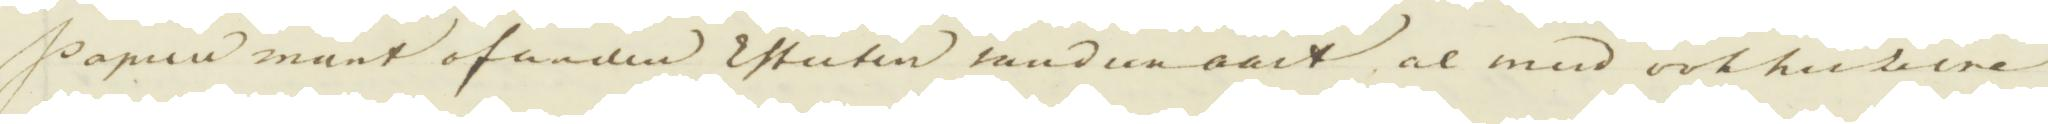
Papiere munt of andere Effecten van dien aart, al werd ook het zelve
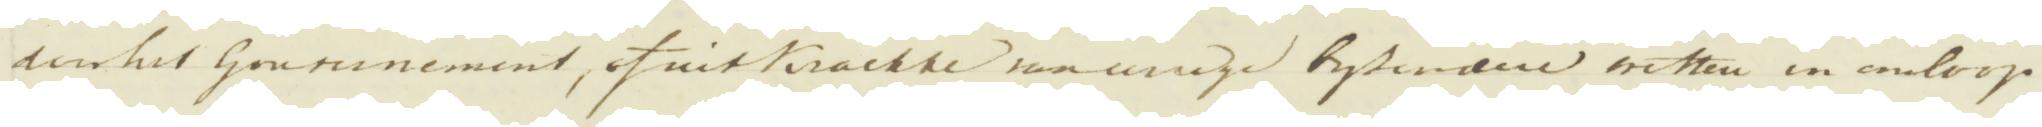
door het Gouvernement, of uit Krachte van eenige byzondere wetten in omloop
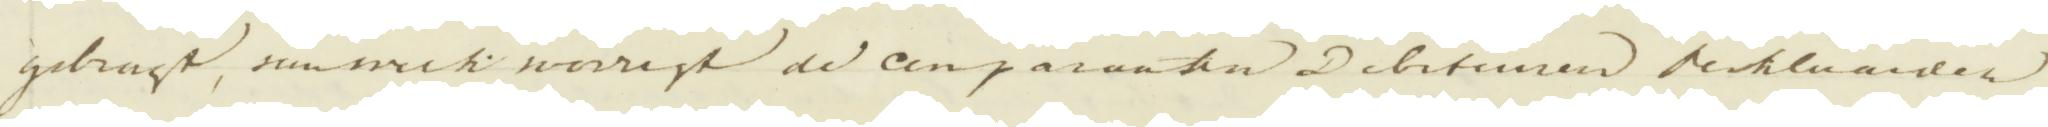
gebragt, van welk voorregt de conparanten Debiteuren verklaarden
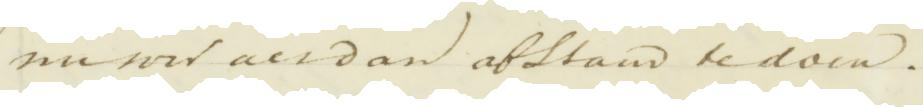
nu voor als dan afstand te doen.
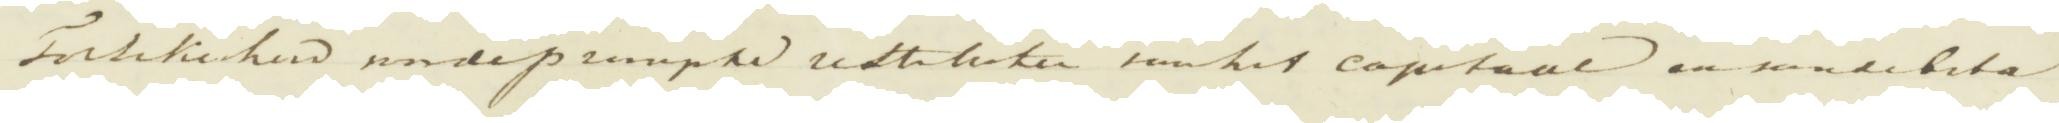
Tot zekerheid van de prompte restitutie van het capitaal en van de beta
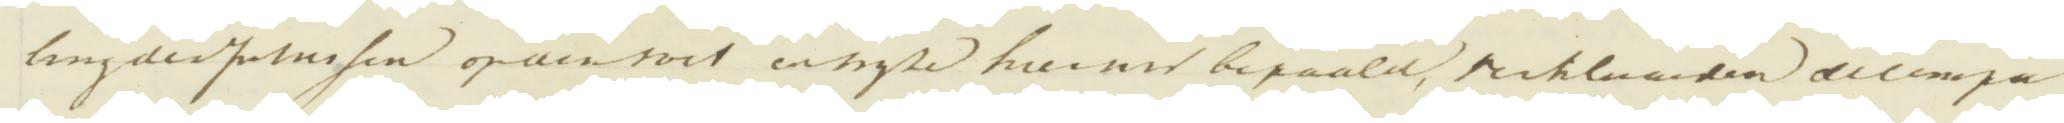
ling der Jntressen op den voet en wyze hiervoor bepaald, verklaarden de compa
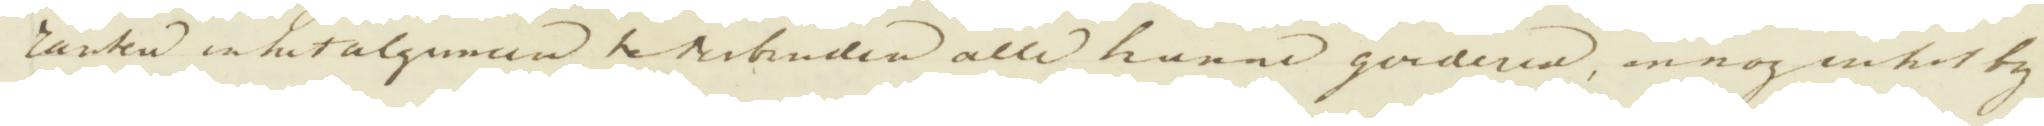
ranten in het algemeen te verbinden alle hunne goederen, en nog in het by
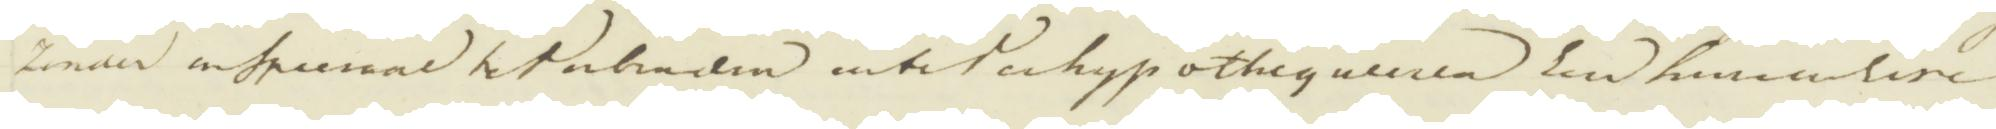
Zonder en speciaal te Verbinden en te Verhypothequeeren Een huis en Erve
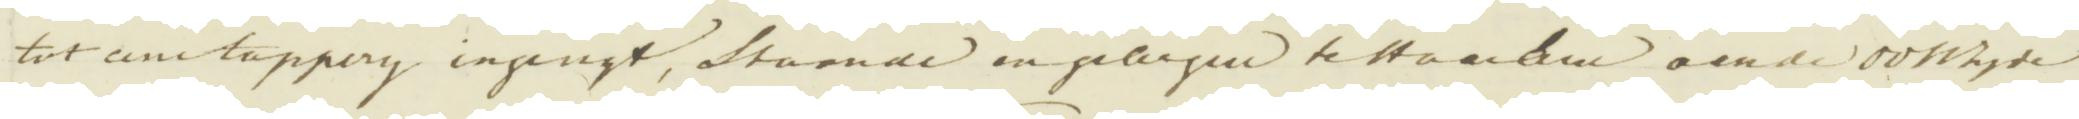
tot eene tappery ingerigt, Staande en geleegen te Haarlem aen de Oostzyde
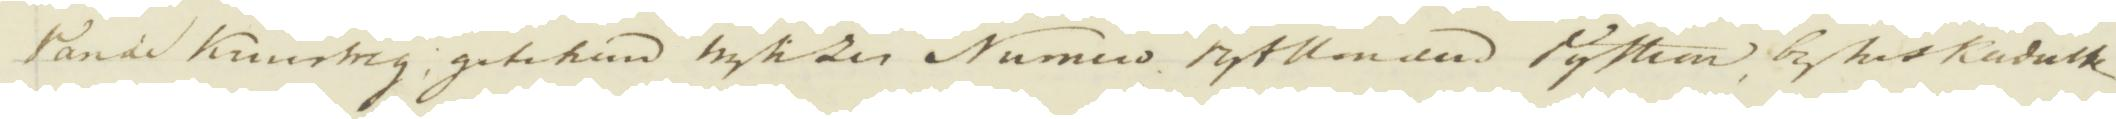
Van de Kruisweg, getekend Wyk Zes Numerd vyf Honderd Vyftien, by het Kadaster
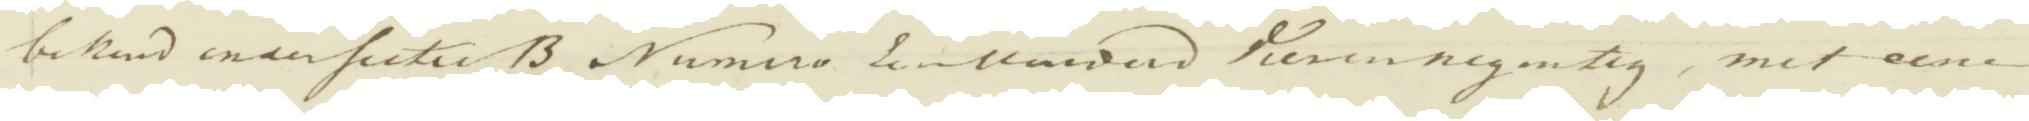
bekend onder Sectie B Numero Een honderd Vier en negentig, met eene
